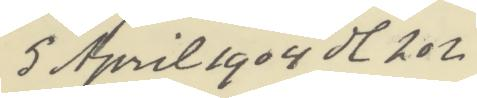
5 April 1904 dl 202
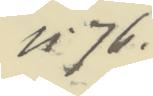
n' 76
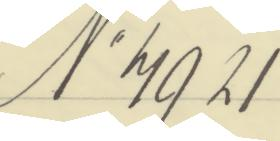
No 4921
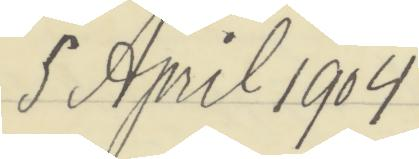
5 April 1904
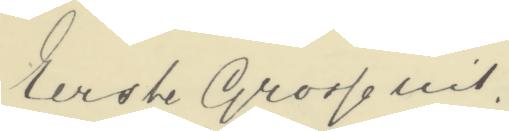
Eerste Grosse uit
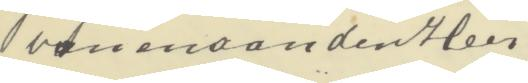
van en aan den Heer
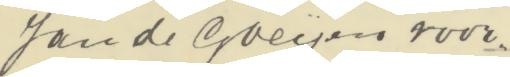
Jan de Goeijen voor
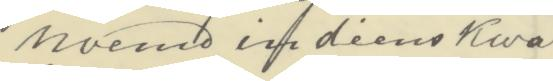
noemd in diens Kwa
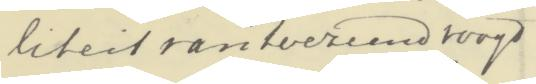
liteit van toeziend voogd
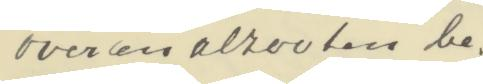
over en alzoo ten be
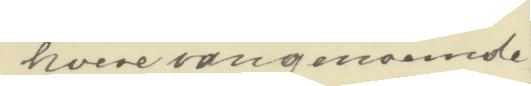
hoeve van genoemde
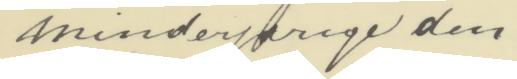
minderjarige den
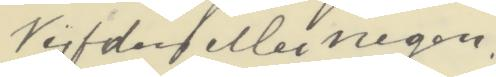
vijfden Mei negen
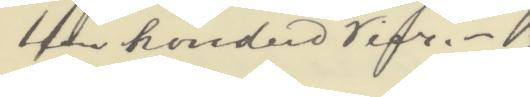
tien honderd Vier. —
